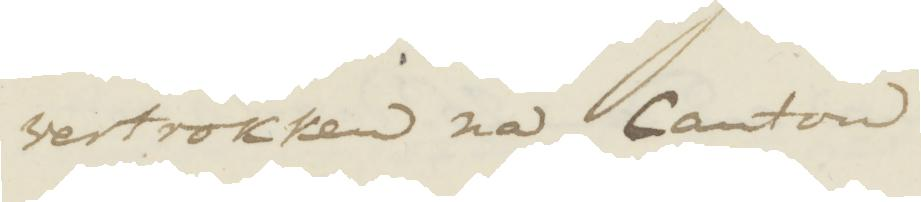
vertrokken na Canton
